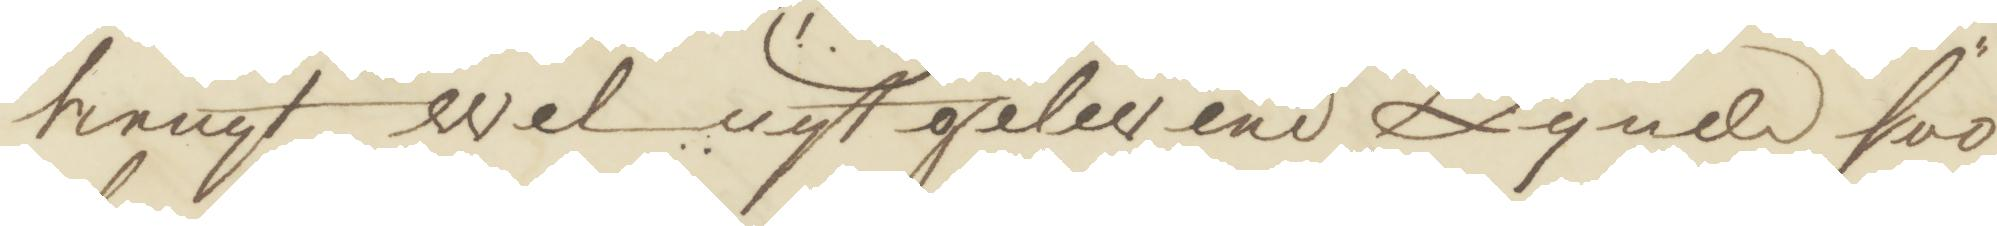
kruijt wel uijtgeleverd Zynde soo
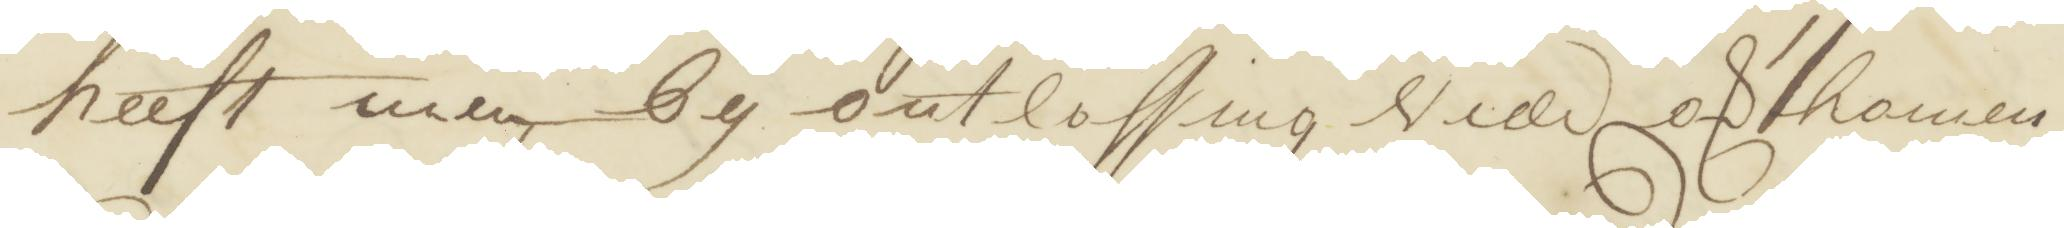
heeft men by ontlossing vide overkomen,
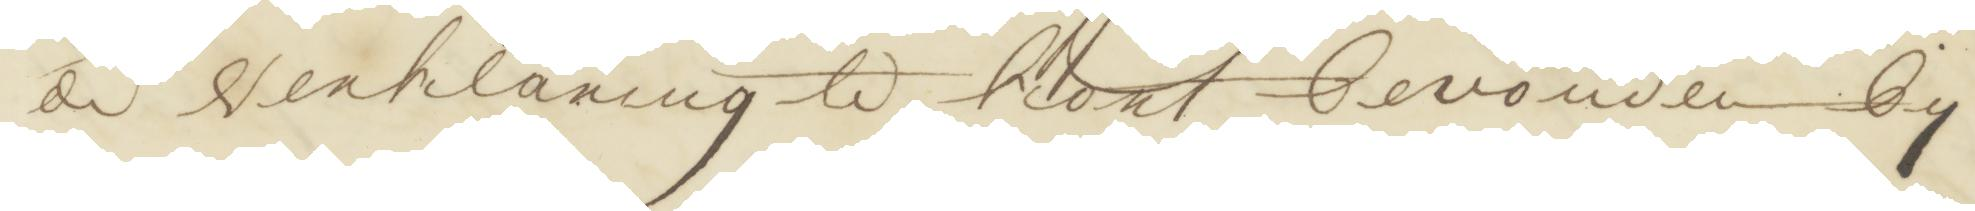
de verklaring te kort bevonden bij
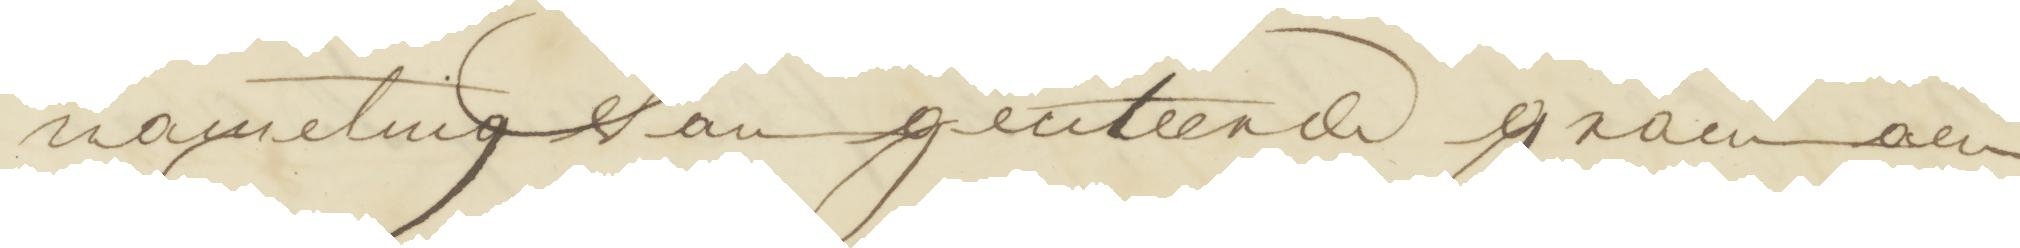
nameting van geciteerde graen aen
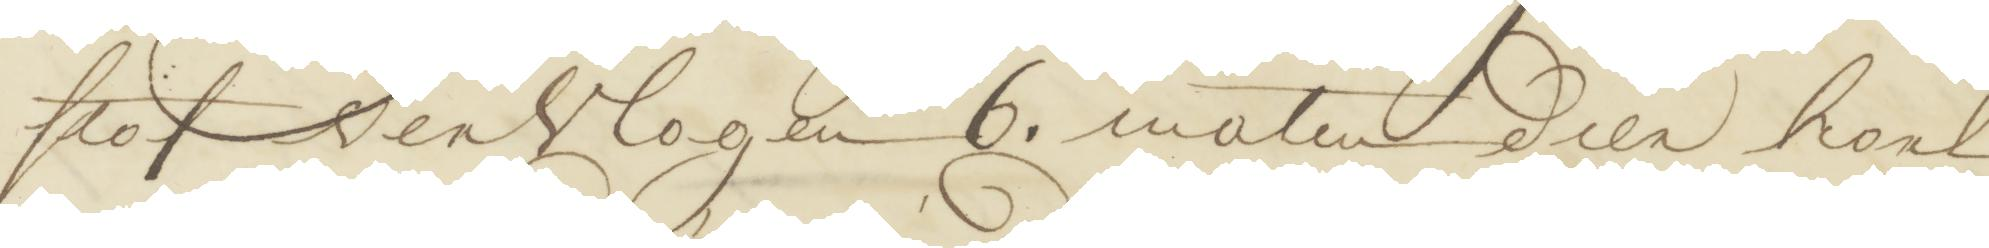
stof vervlogen 6. maten dier korl
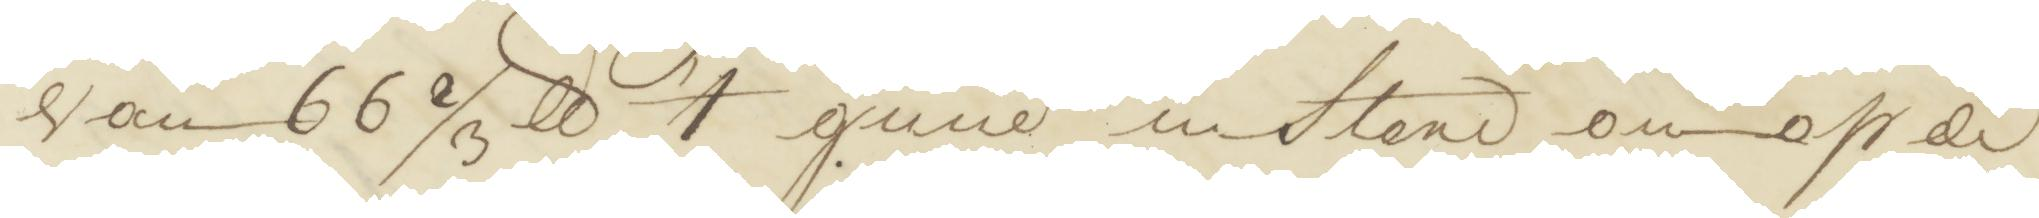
van 66 2/3 lb 't gune in sterd om op de
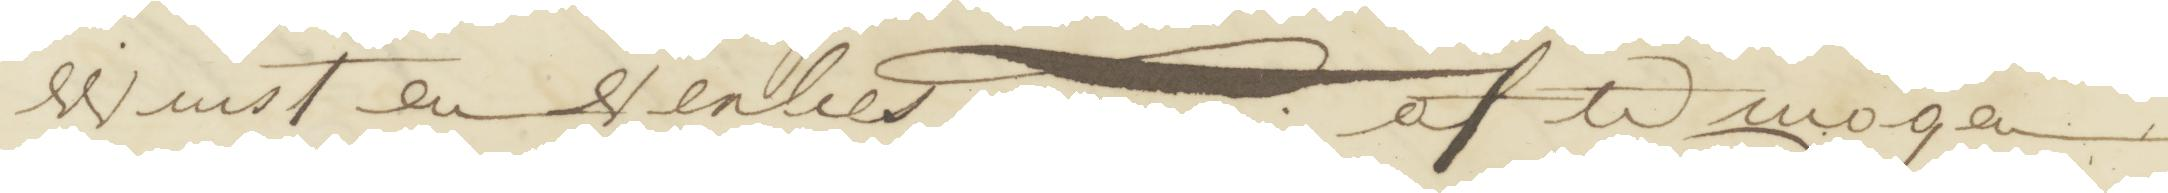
winst en verlies reecq: af te mogen
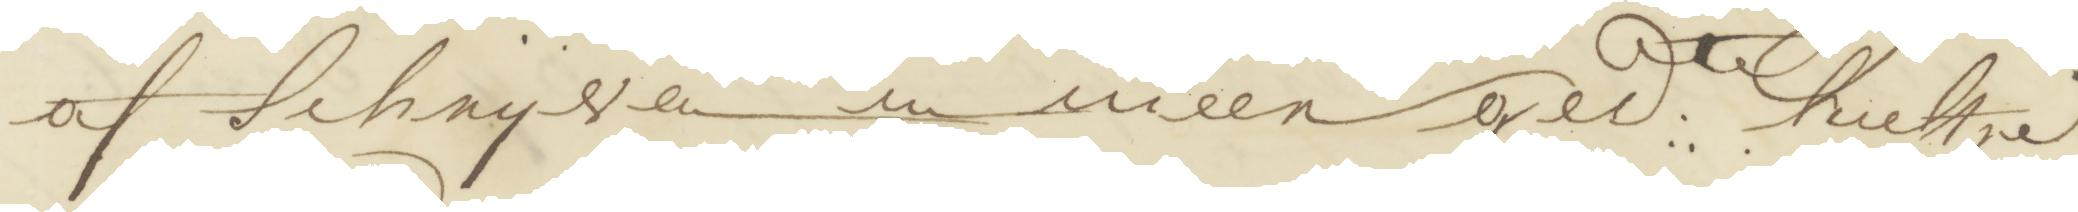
af schrijven, in meer ged:te kieltje
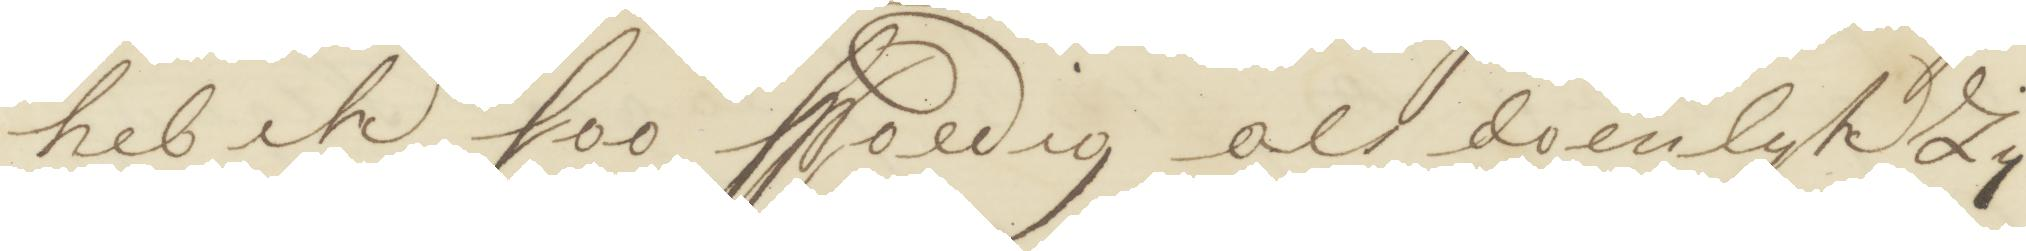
heb ik soo spoedig als doenlyk Zij
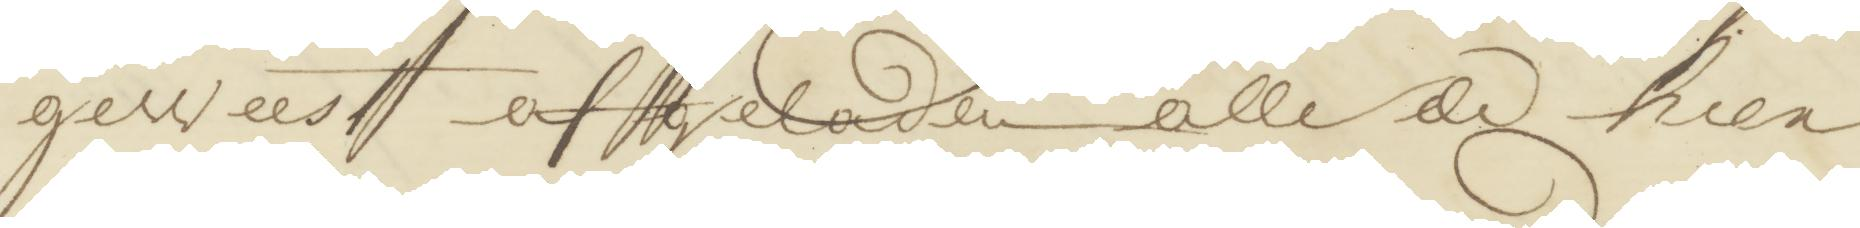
geweest afgeladen alle de hier
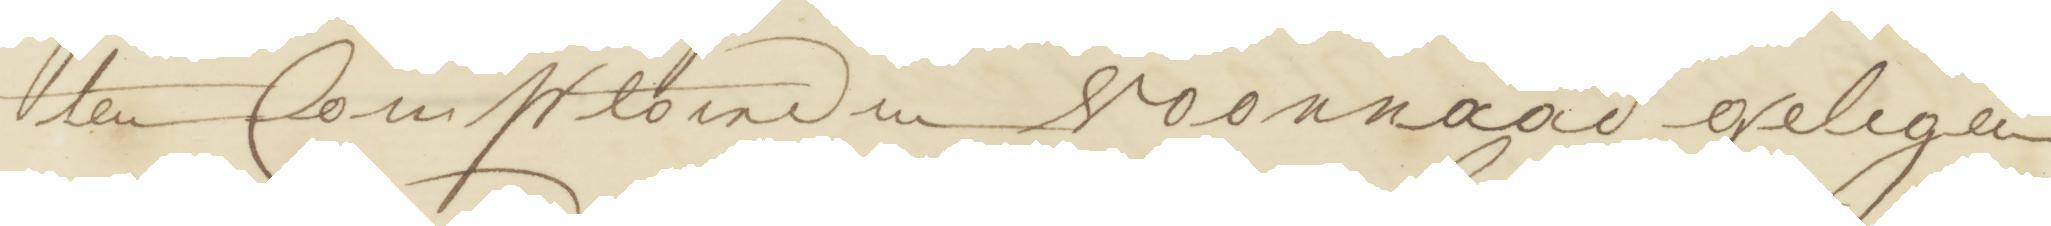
ten Comptoire in voorraad gelegen
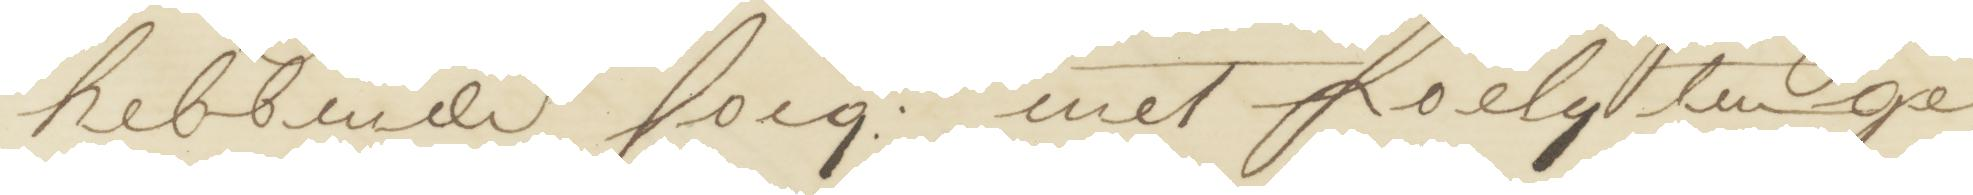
hebbende socq:ls met foelij ten ge
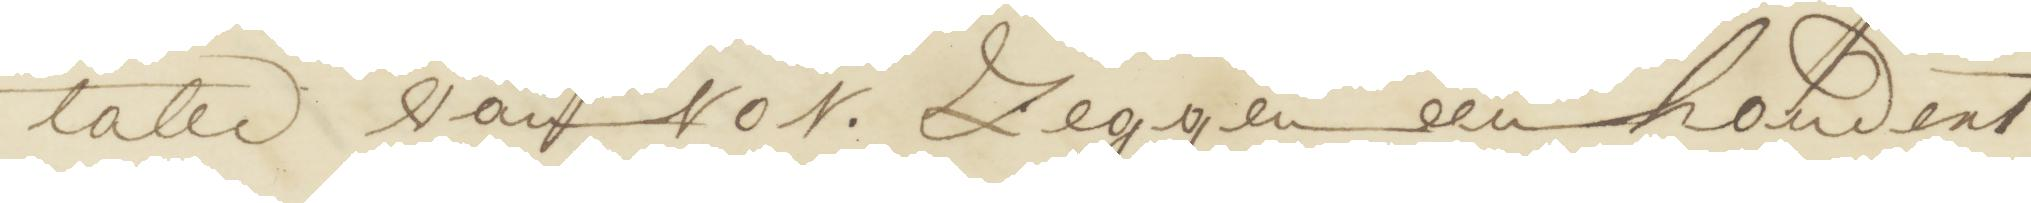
talle van 101. Zeggen een hondert
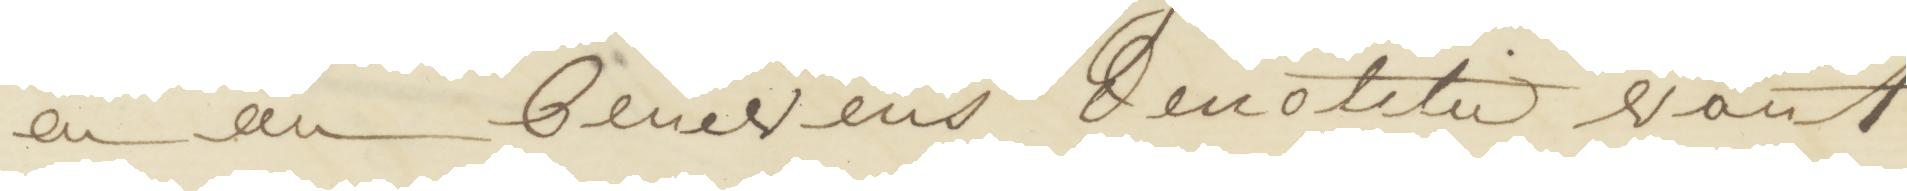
en een benevens de notitie van 't
